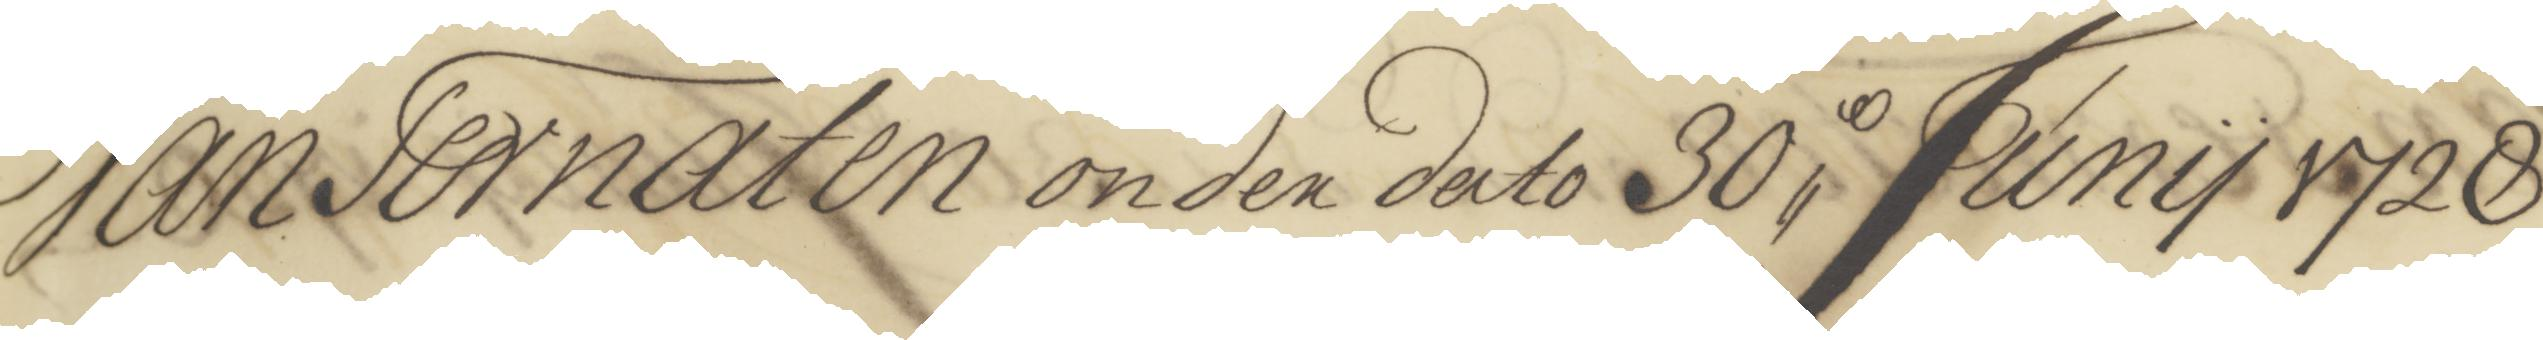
Van Ternaten onder dato 30„e Junij 1728
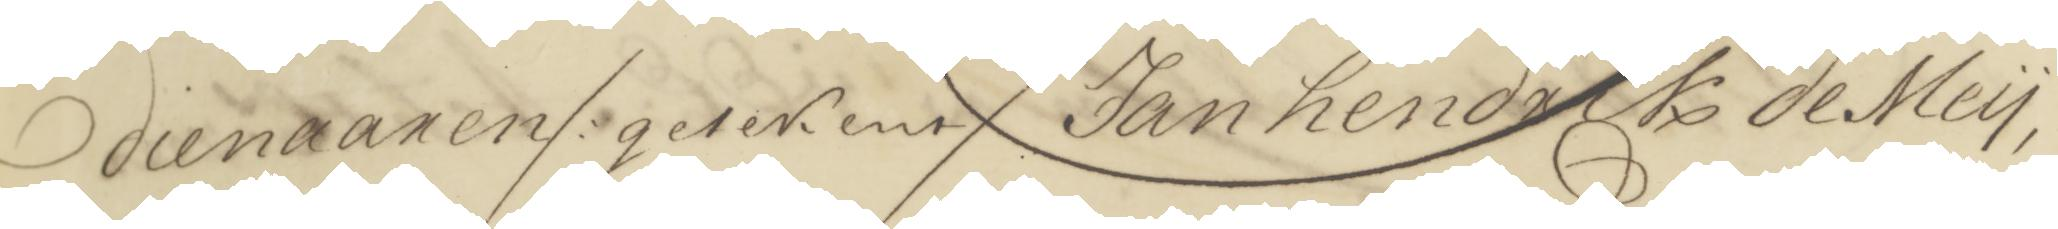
dienaaren /:getekent/ Ian hendrik de Meij,
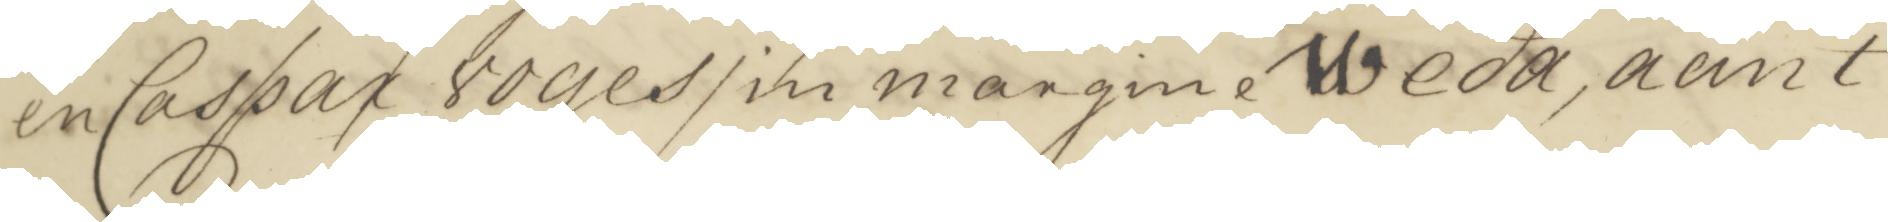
en Caspar voges / in margine Weda, aan’t
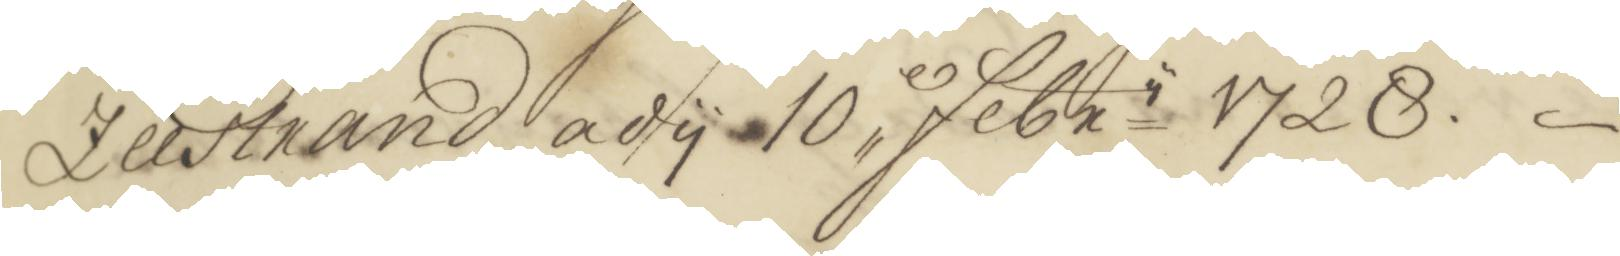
Zeestrand adij 10„e febr=ij 1728. ~
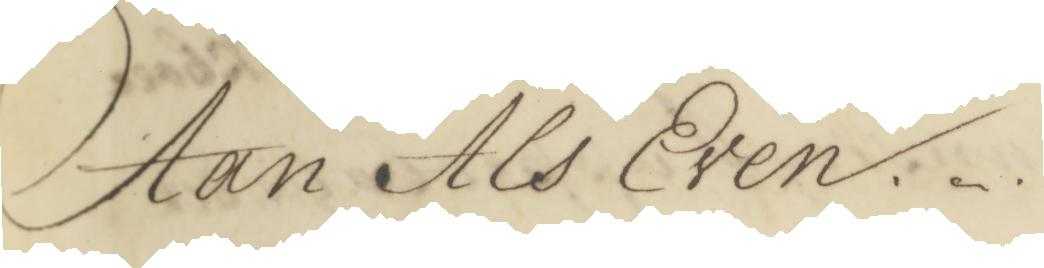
Aan Als Even.~
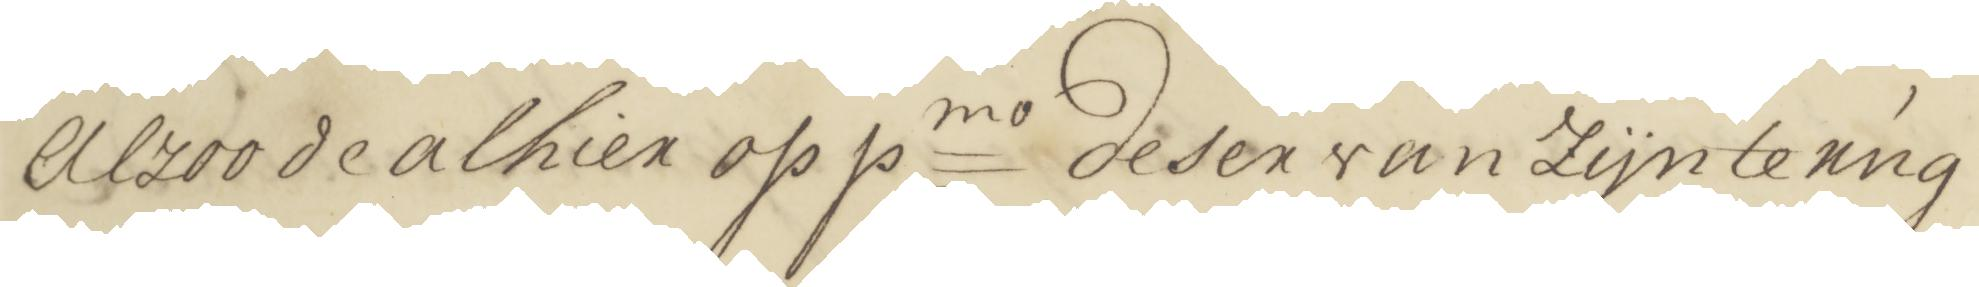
Alzoo de alhier op p=mo deser van Zijn terug
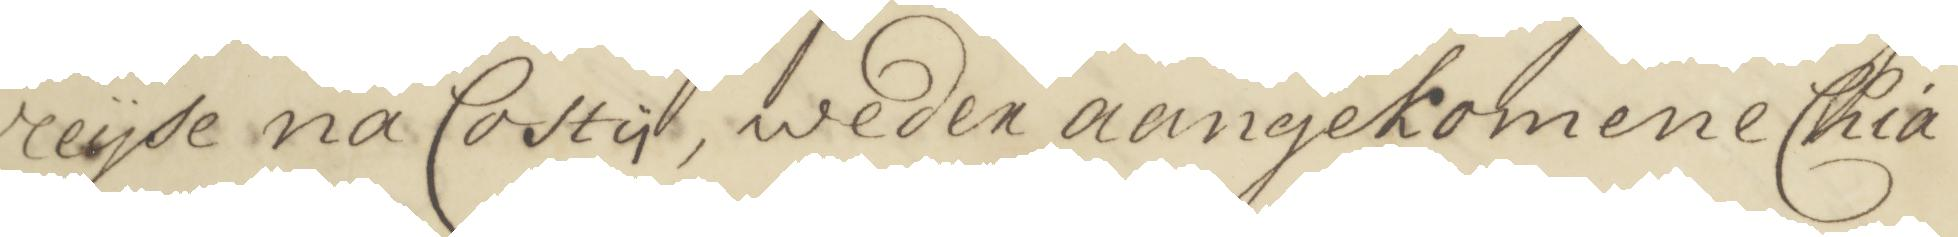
reijse na Costij, weder aangekomene Chia
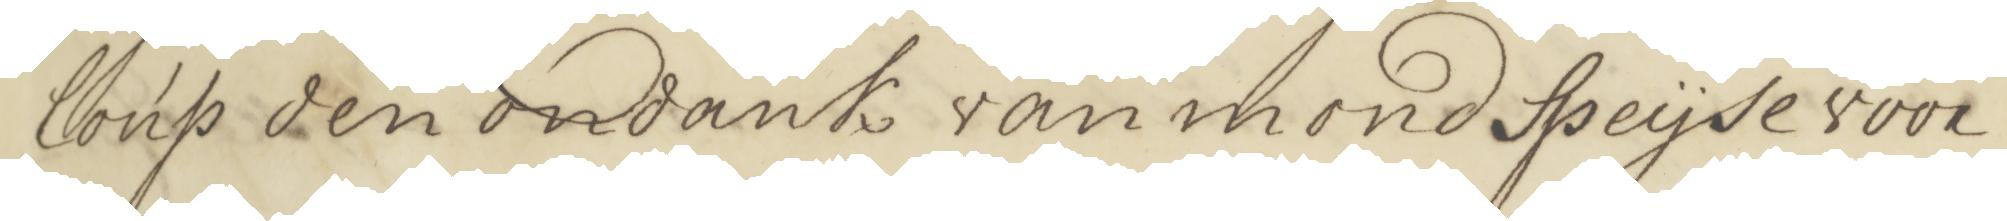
loup den ondank van mond Speijse voor
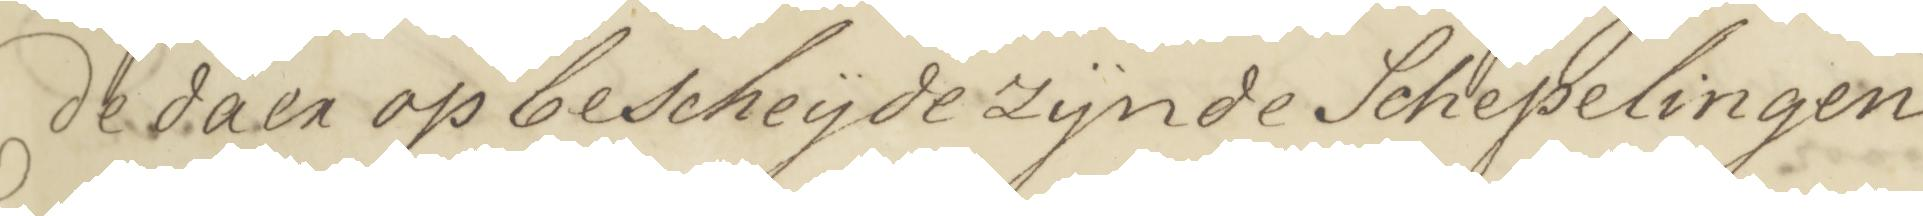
de daer op bescheijde zijnde Schepelingen
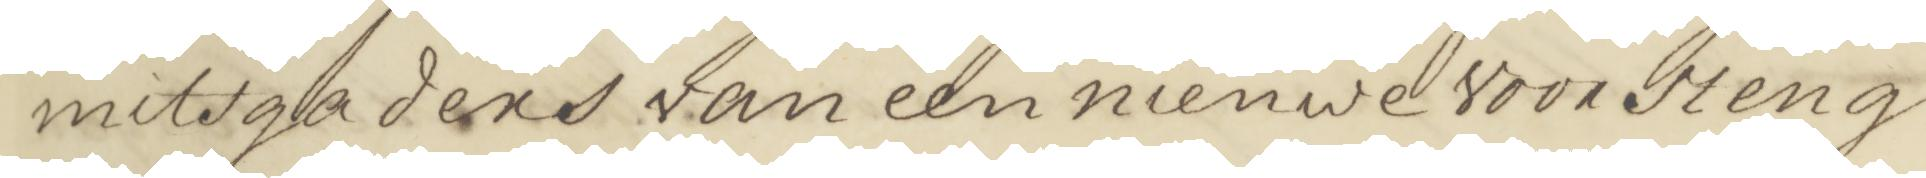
mitsgaders van een nieuwe voorsteng
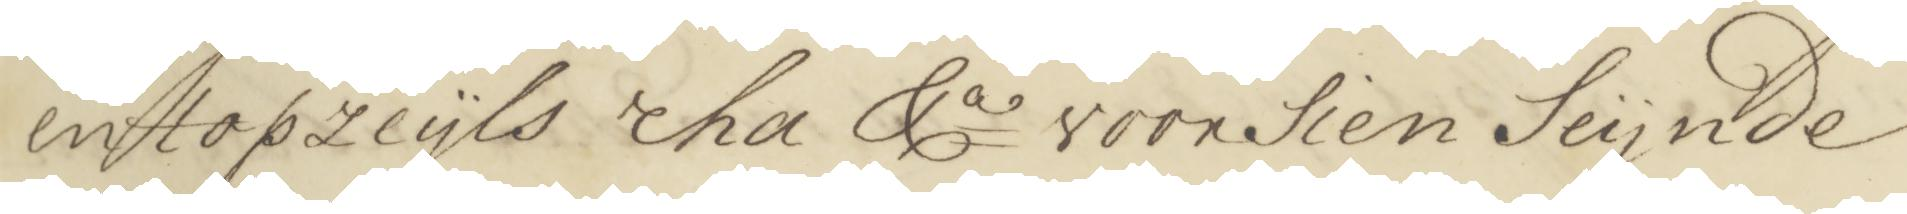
en topzeijls rha &=a voorsien Seijnde
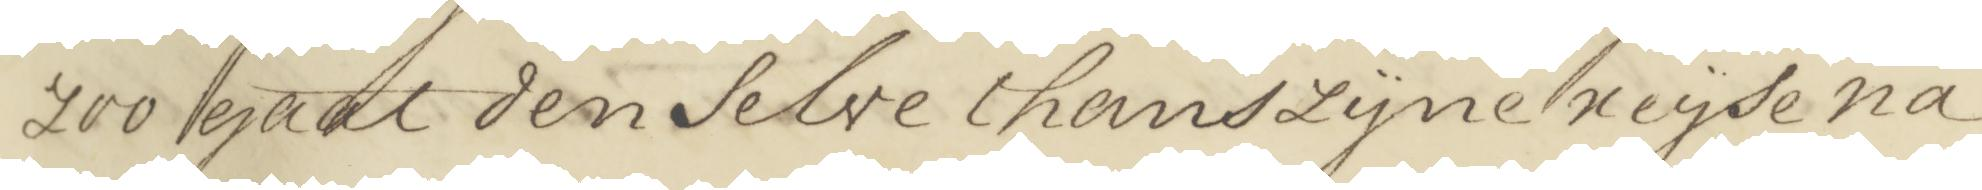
zoo gaat den Selve thans zijne reijse na
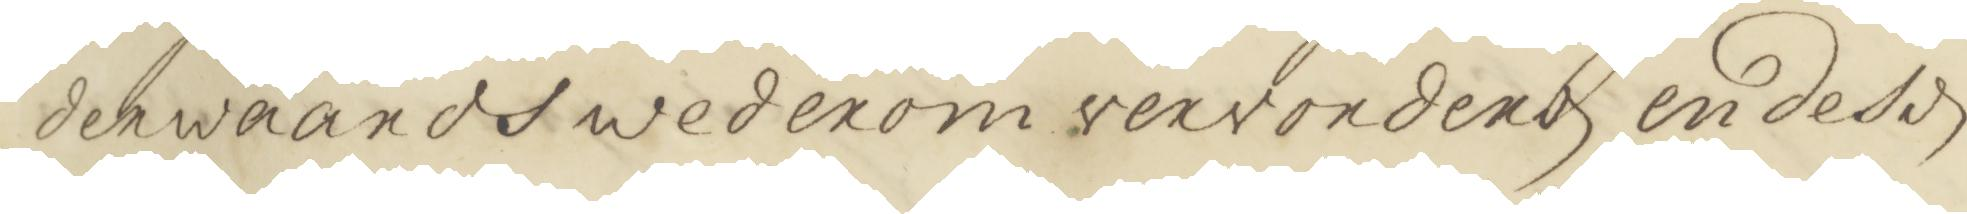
derwaards wederom vervorderen en desen
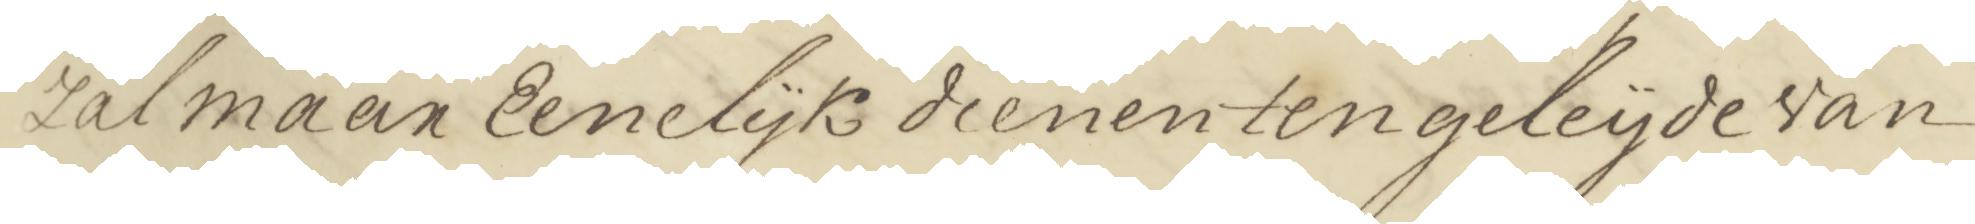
zal maar Eenelijk dienen ten geleijde van
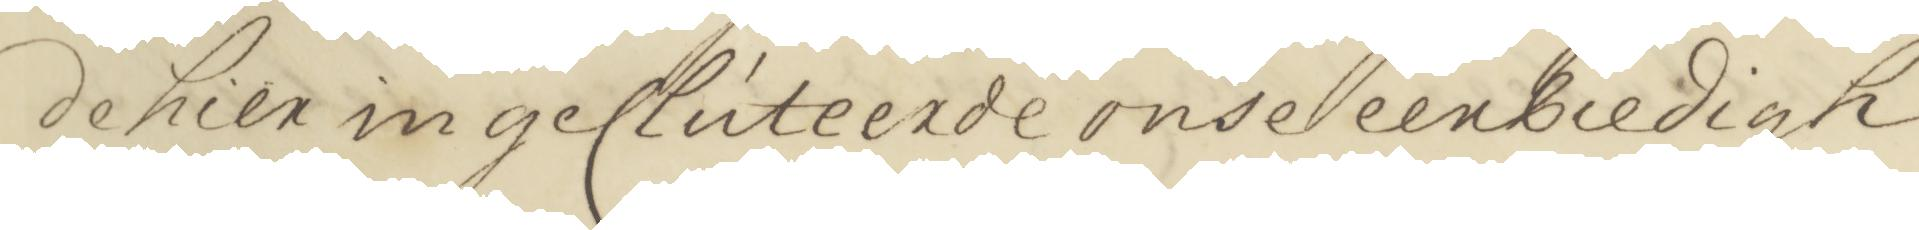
de hier in gecluteerde onse eerbiedigh
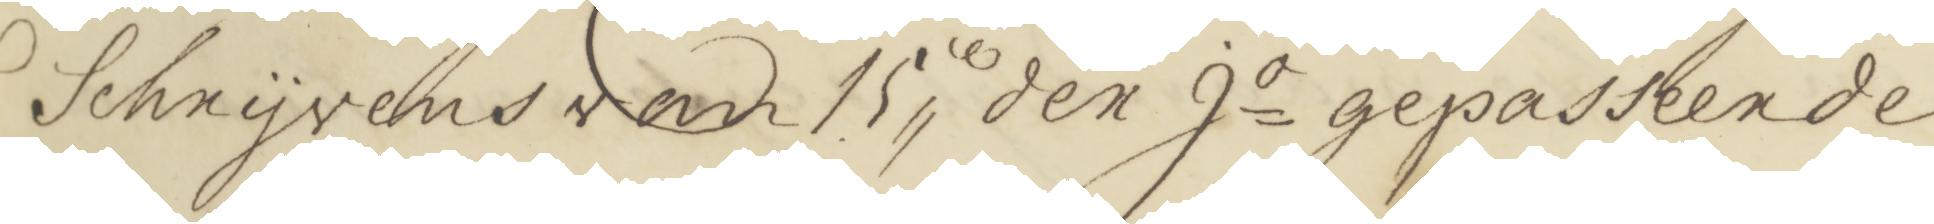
Schrijvens van 15„e der J=o gepasseerde
